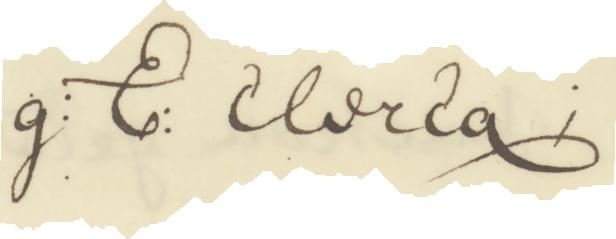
g: E: clercq;
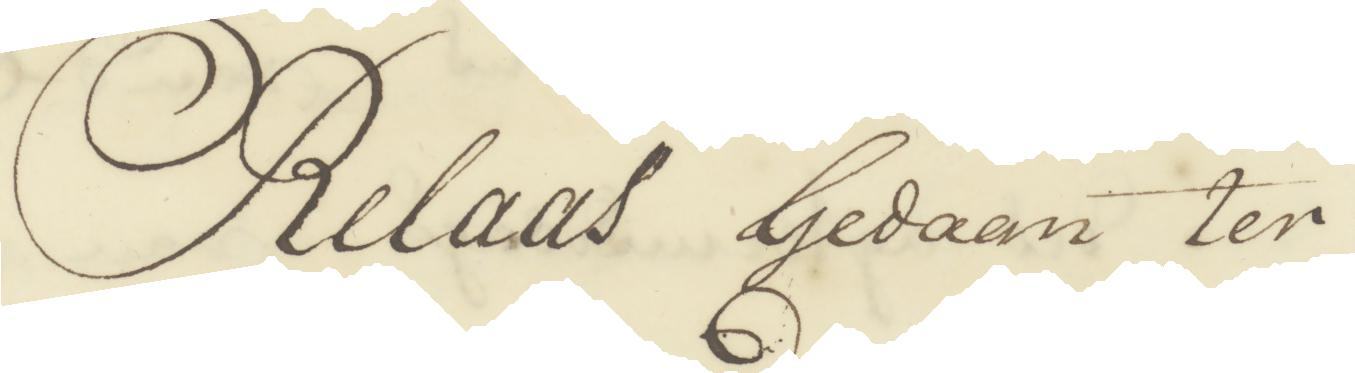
Relaas Gedaan ter
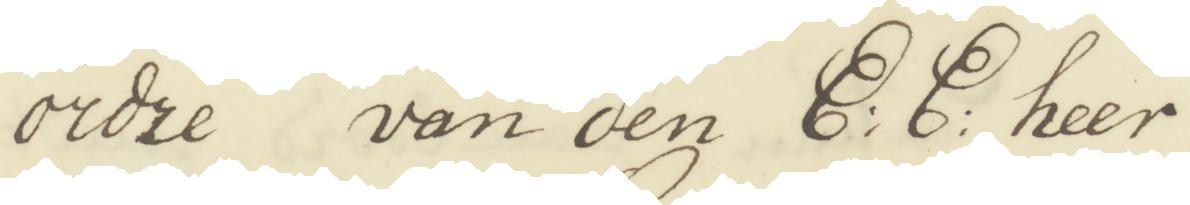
ordre van den E: E: heer
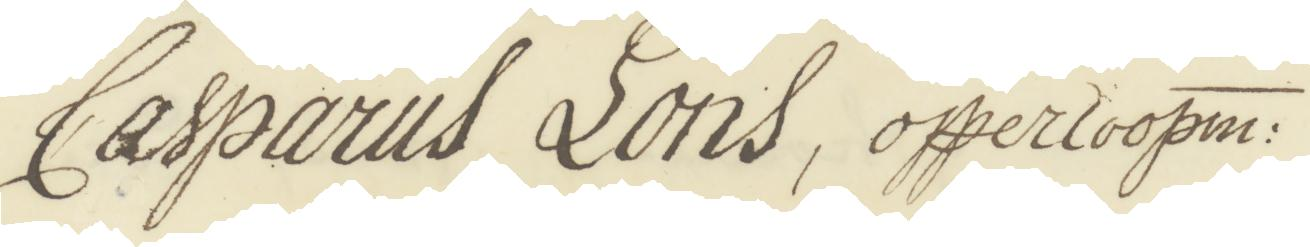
Casparus Lons, oppercoopm:
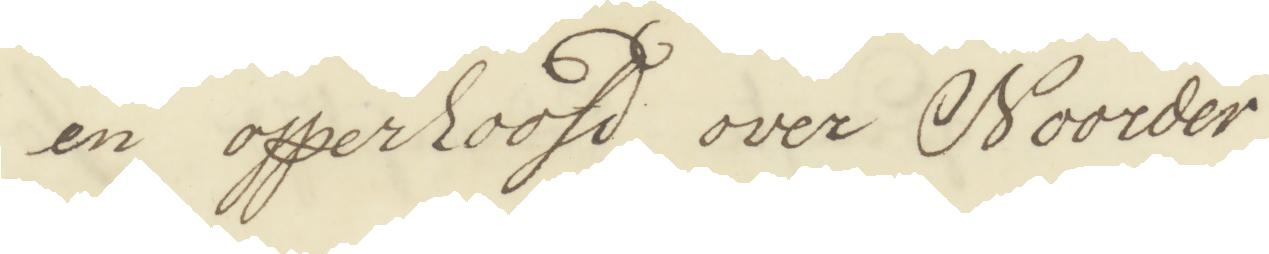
en opperhoofd over Noorder
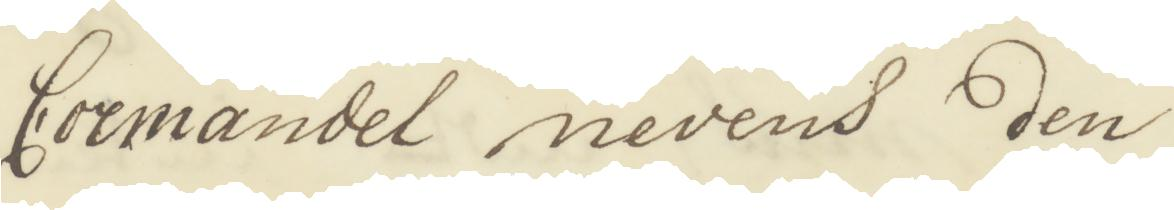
Cormandel nevens den
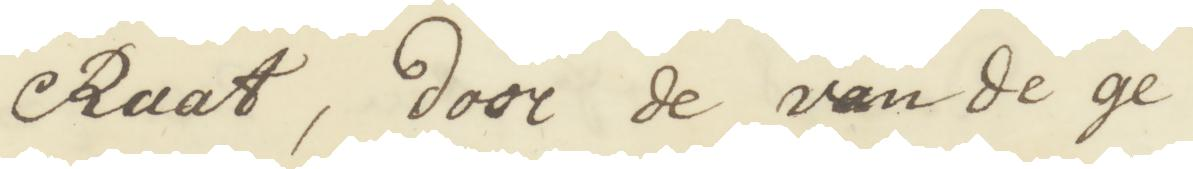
Raat, door de van de ge
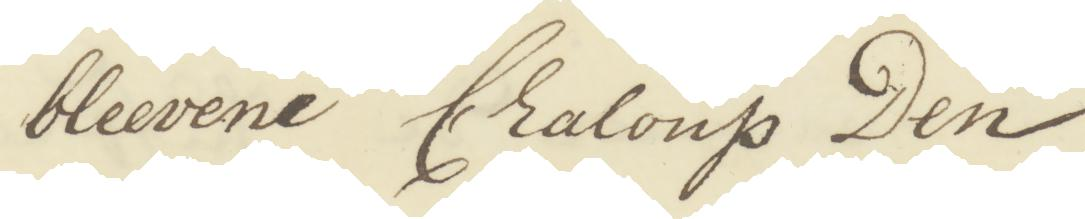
bleevene Chaloup Den
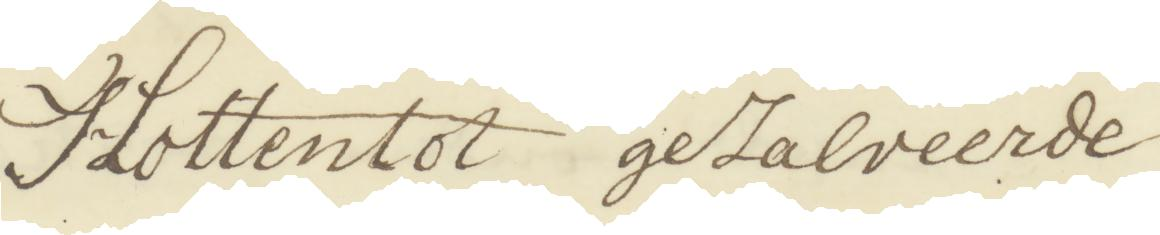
Hottentot gezalveerde
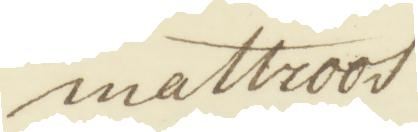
mattroos
